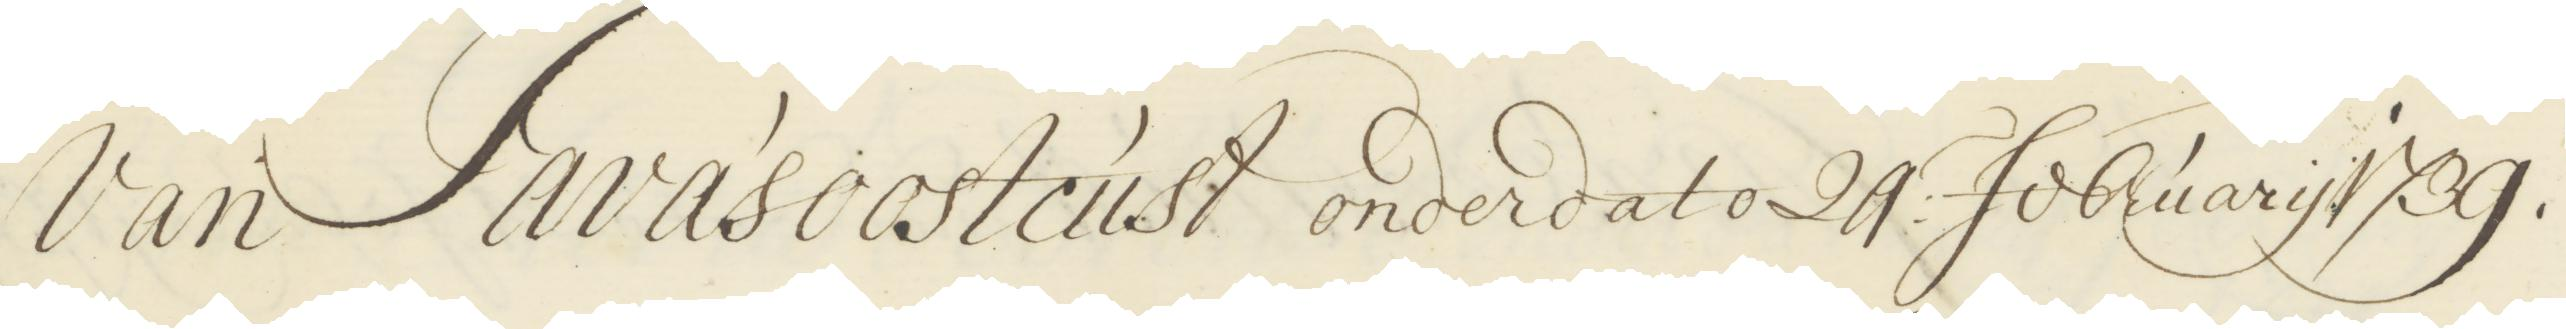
Van Iava's oostcust onder dato 24:' februarij 1739.
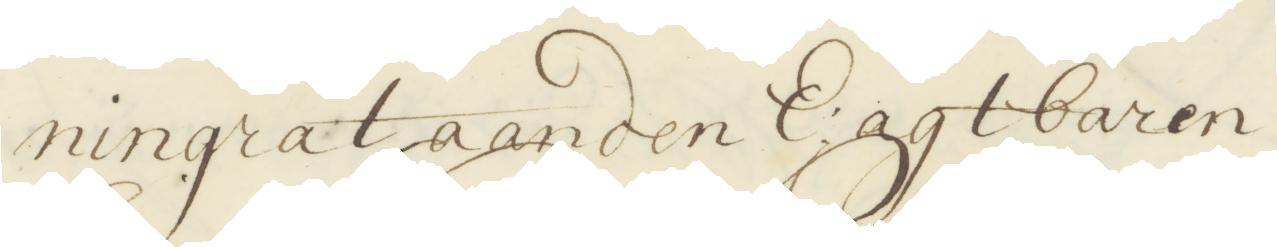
ningrat aan den E: agtbaren
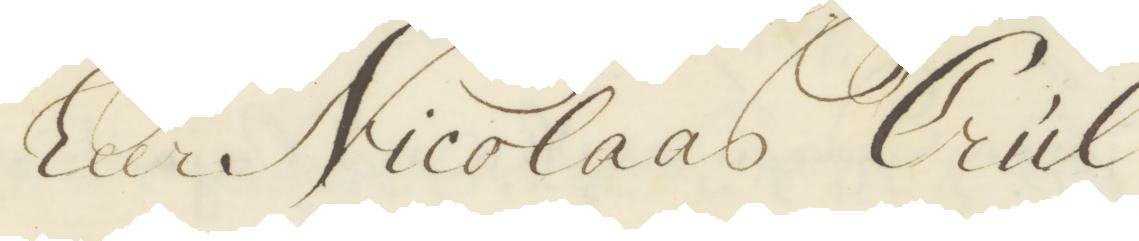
heer Nicolaas Crul
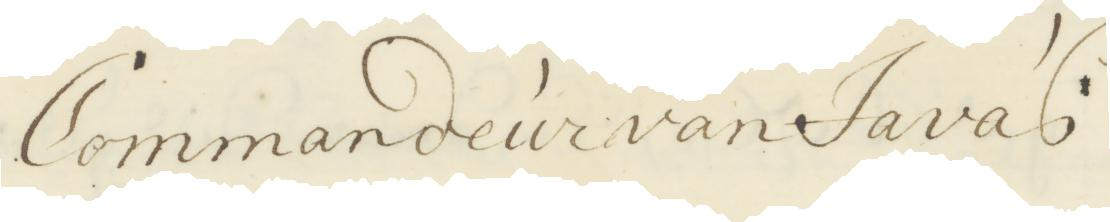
Commandeur van Iava's
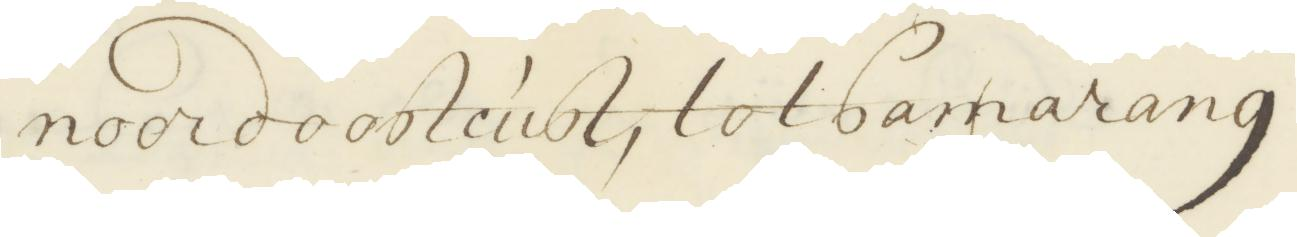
noordoostcust, tot samarang
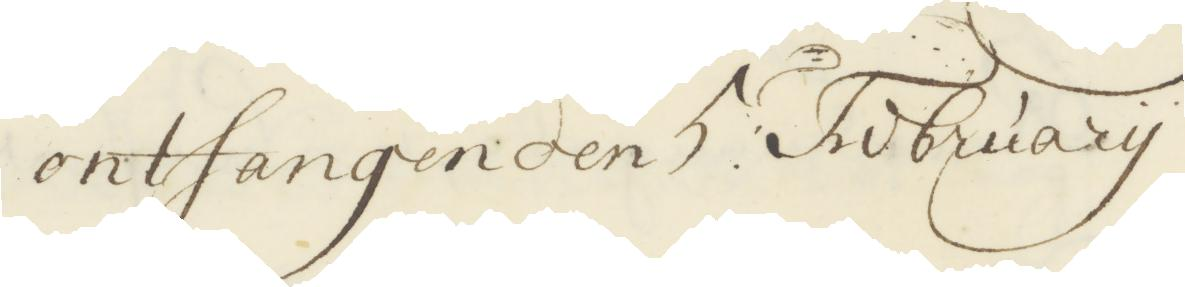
ontfangen den 5:' Februarij
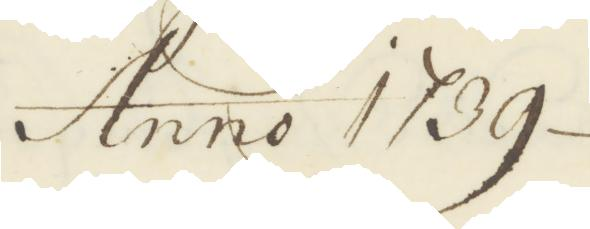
Anno 1739-
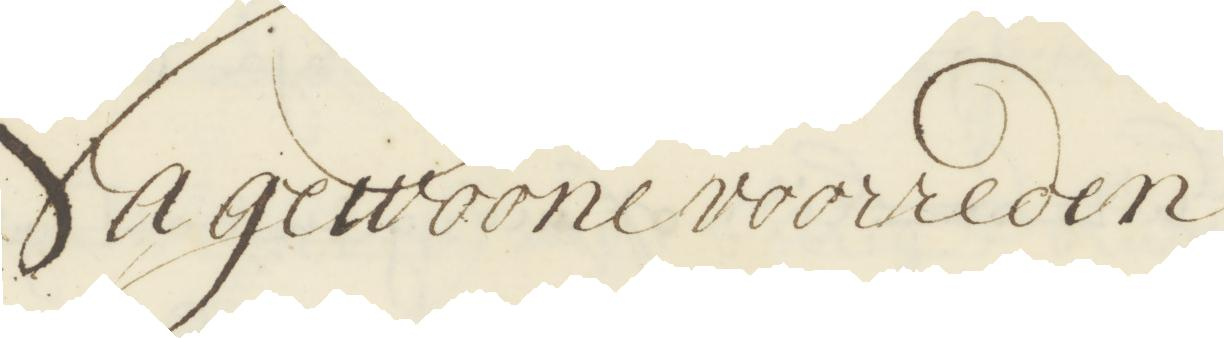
Na gewoone voorreden
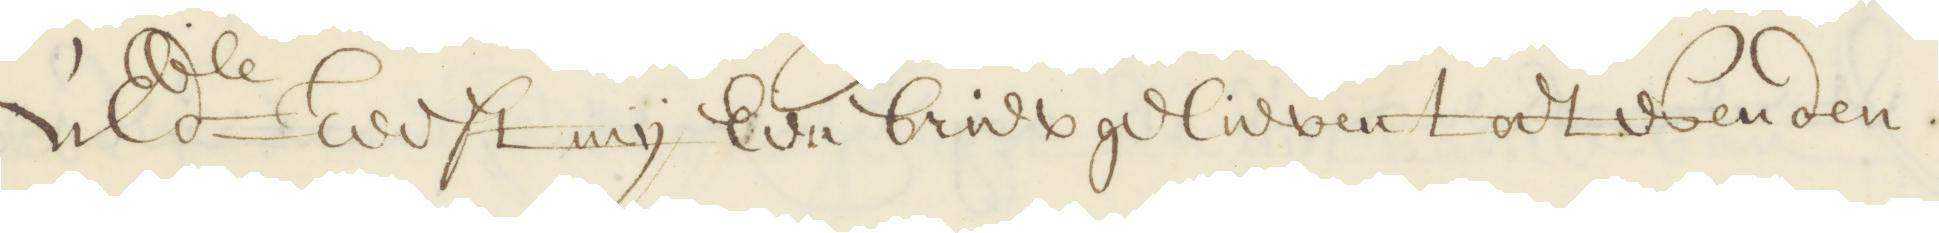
uEd=le heeft mij Een briev gelieven toetesenden.
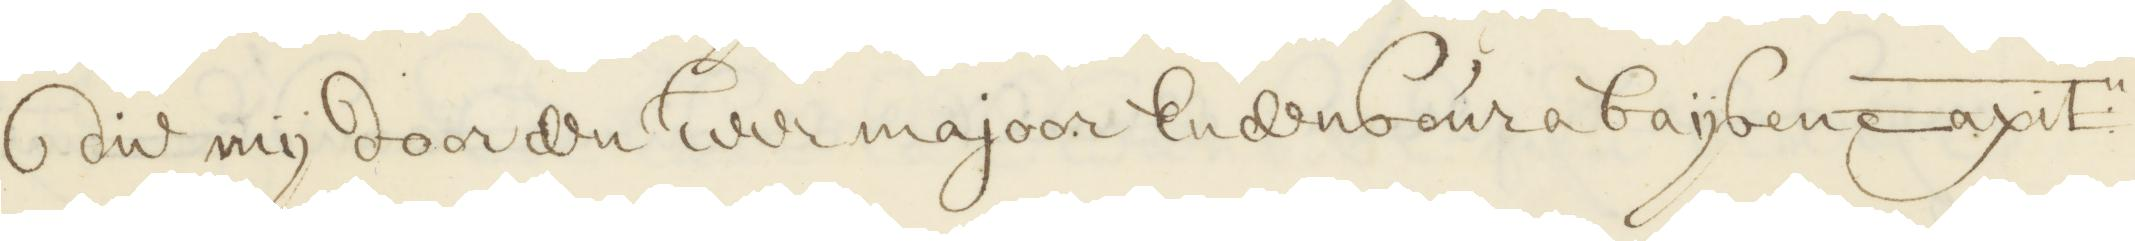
die mij door den heer majoor En densourabaijsen capit:n
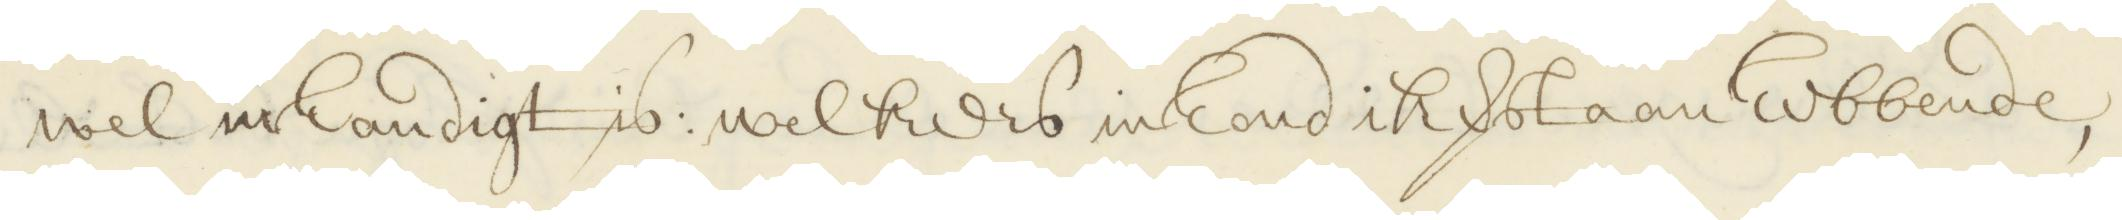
wel inhandigt is: welkers inhoud ik verstaan hebbende,
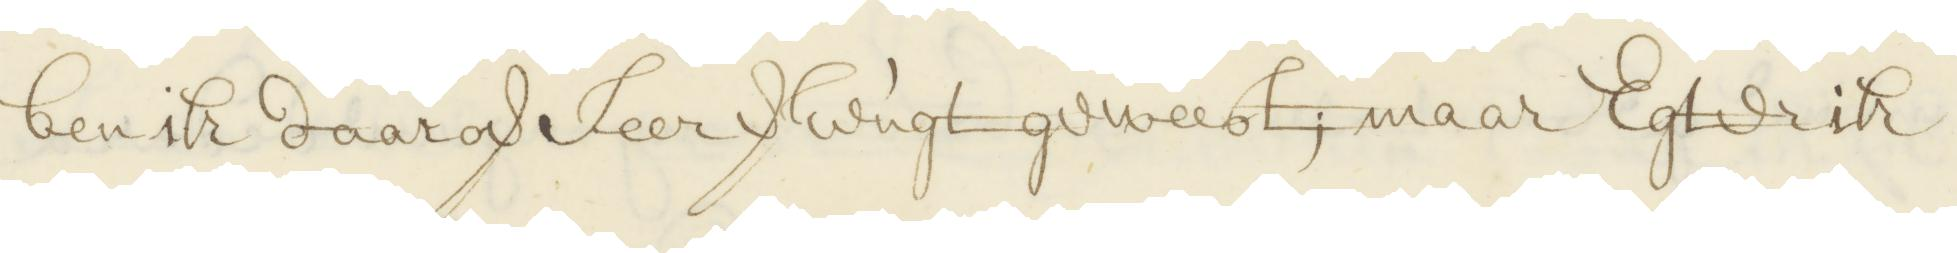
ben ik daar over seer verheugt geweest; maar Egter ik
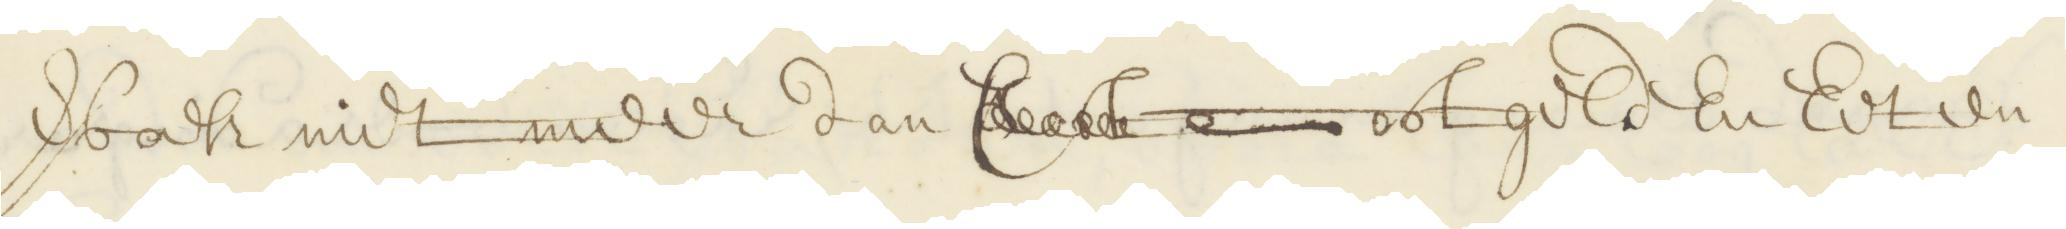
versoek niet meer dan Cleere costgeld En Eeten
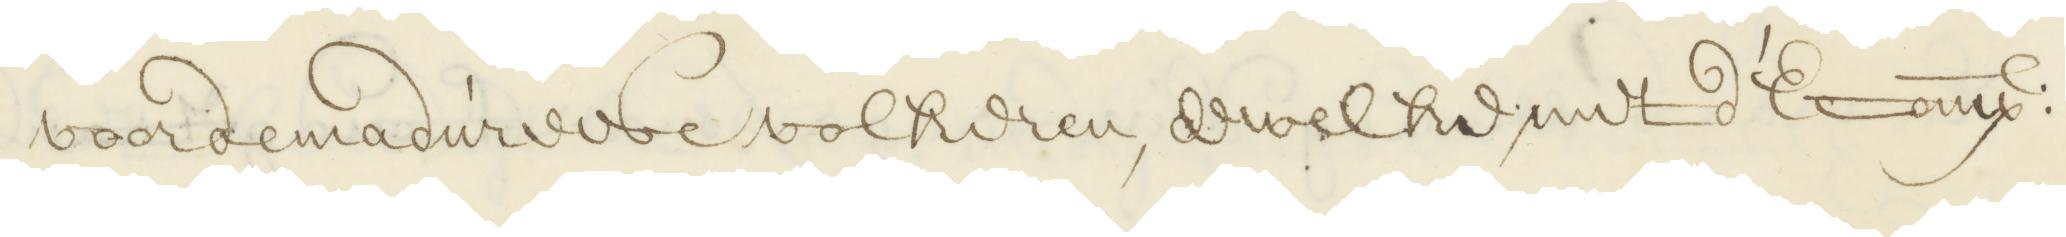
voor de madureese volkeren, dewelke met d’ EComp:
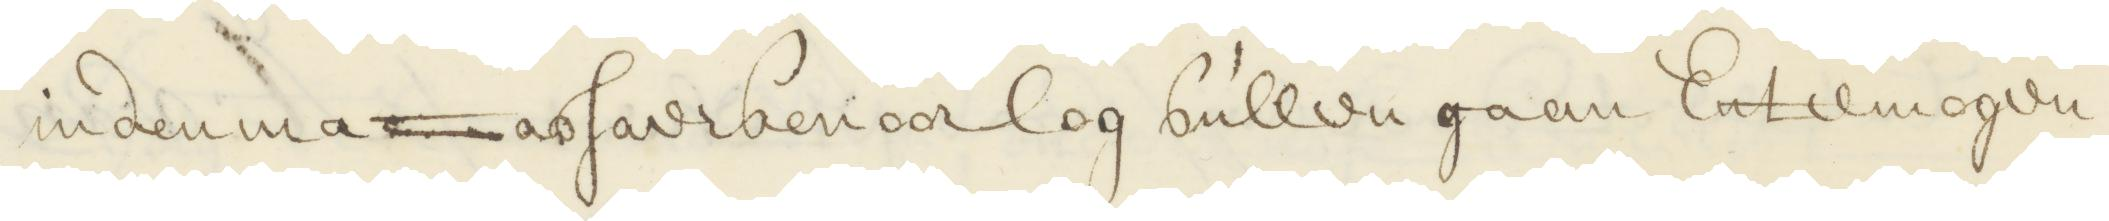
in den macassaersen oorlog sullen gaan Ente mogen
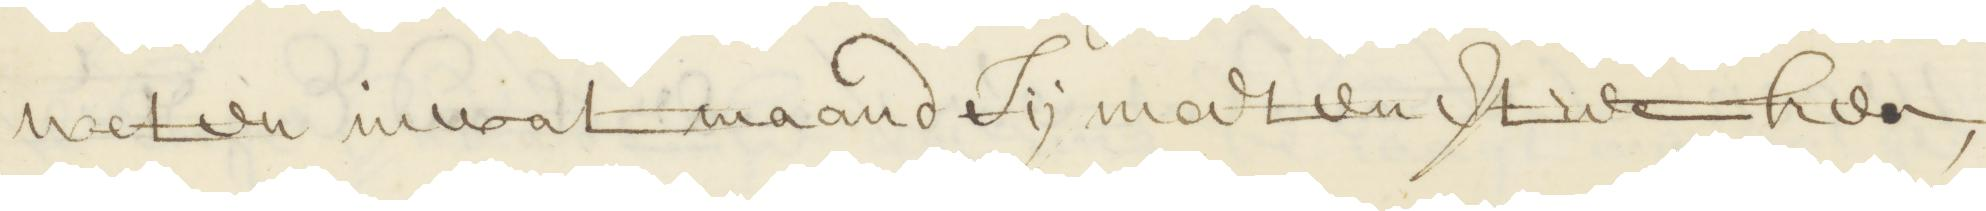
weten inwat maand sij moeten vertrecken,
